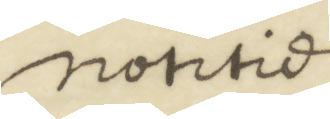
notitie
